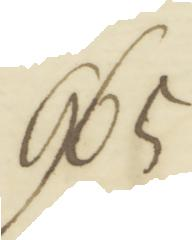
965
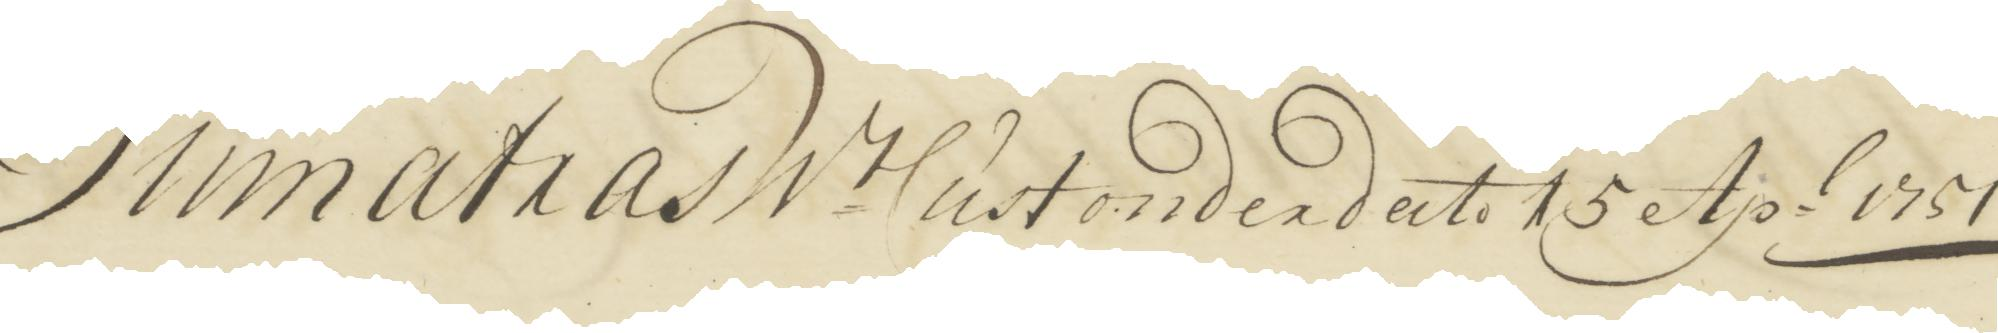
Sumatras W:t Cust onder dato 15 Ap:l 1751
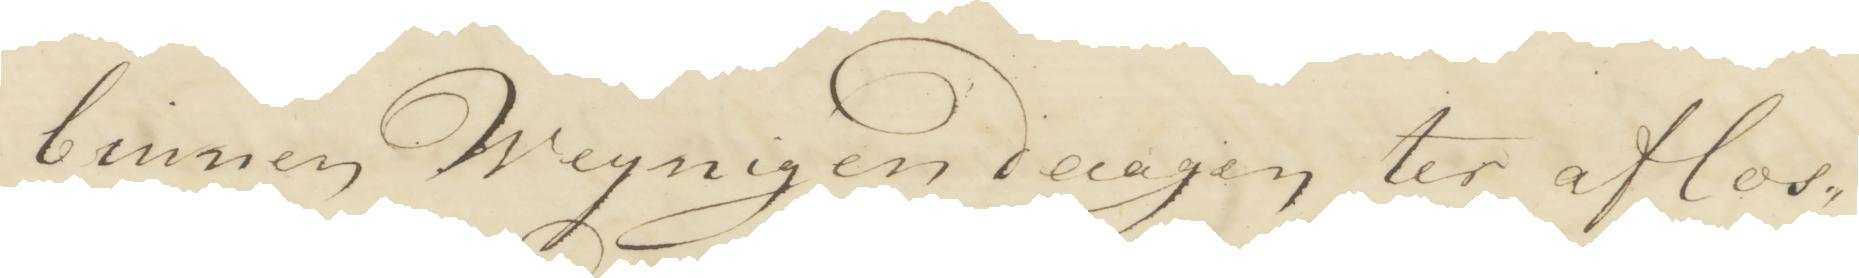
binnen weynigen daagen ter aflos=
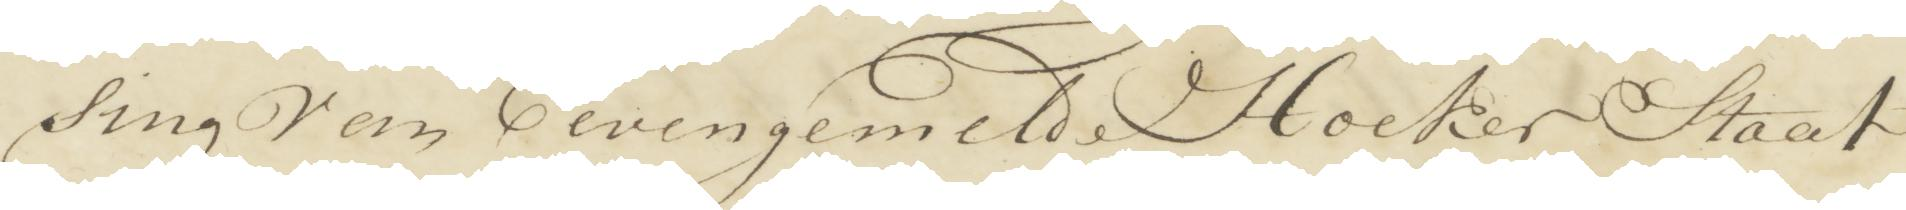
sing van Evengemeld:e Hoeker staat
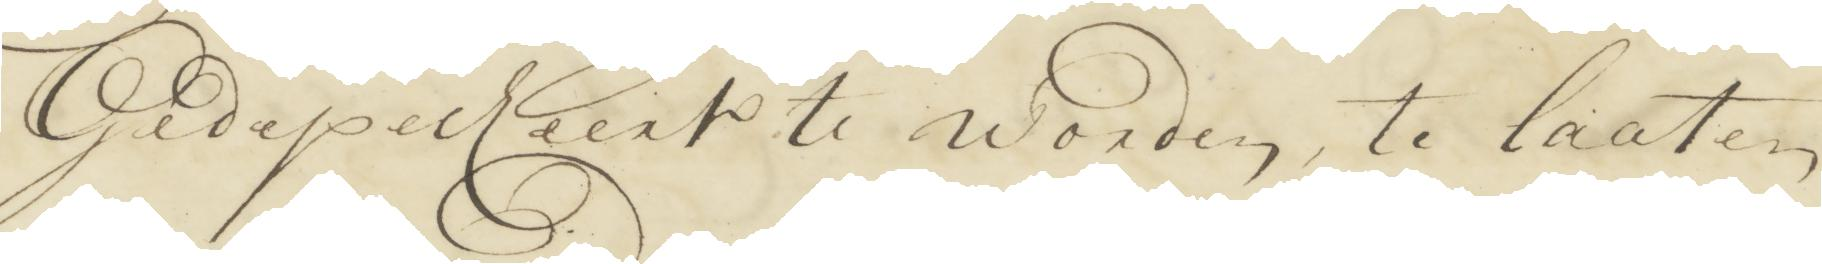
Gedepecheert te worden, te laaten
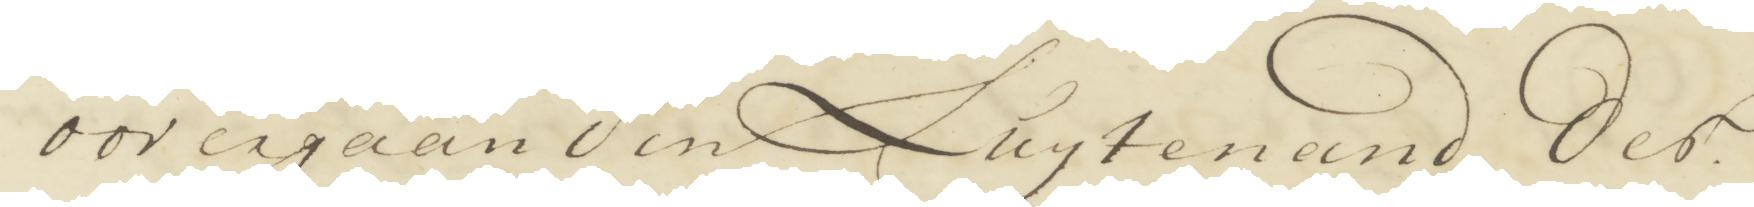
oovergaan den Luytenand der
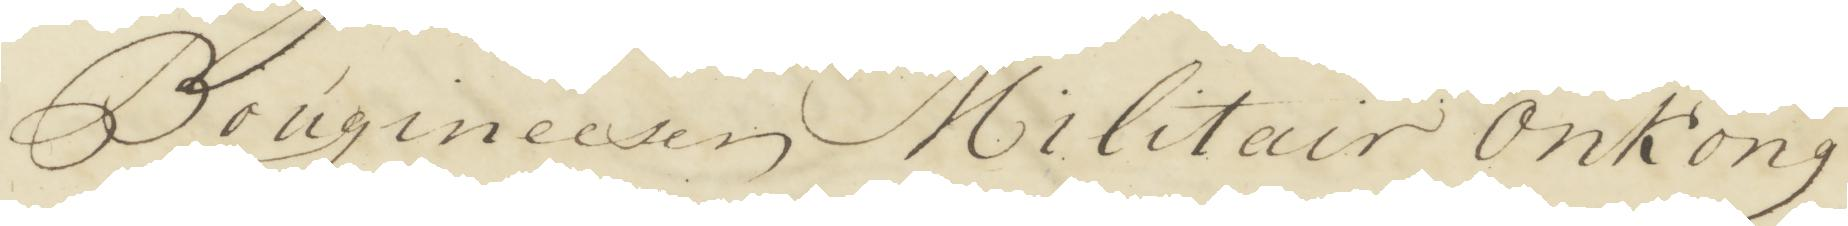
Bougineesen Militair onkong
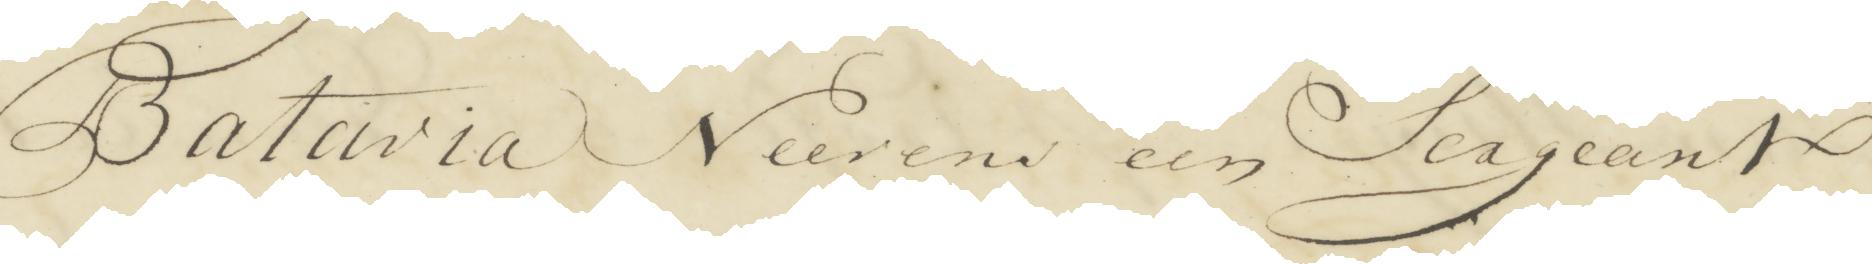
Batavia Neevens een Sergeant
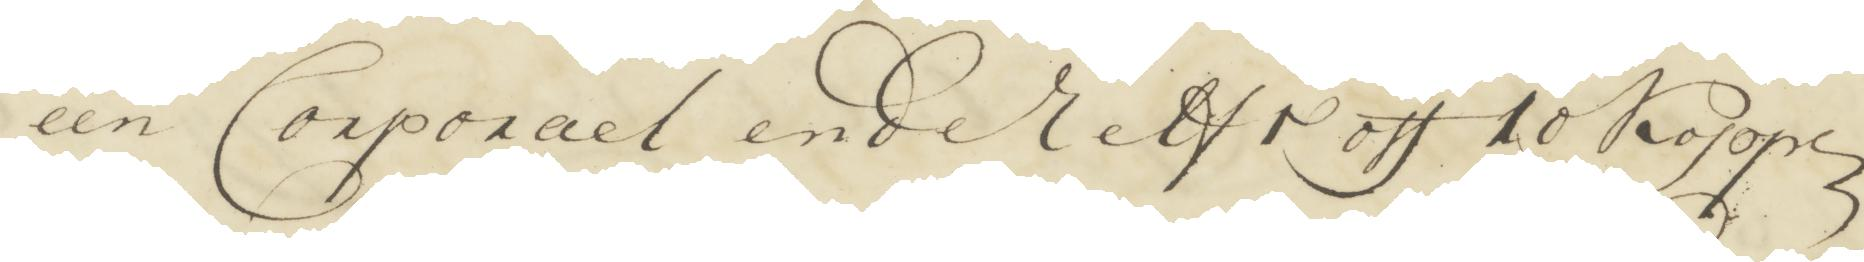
een Corporael en de helft off 10 koppen
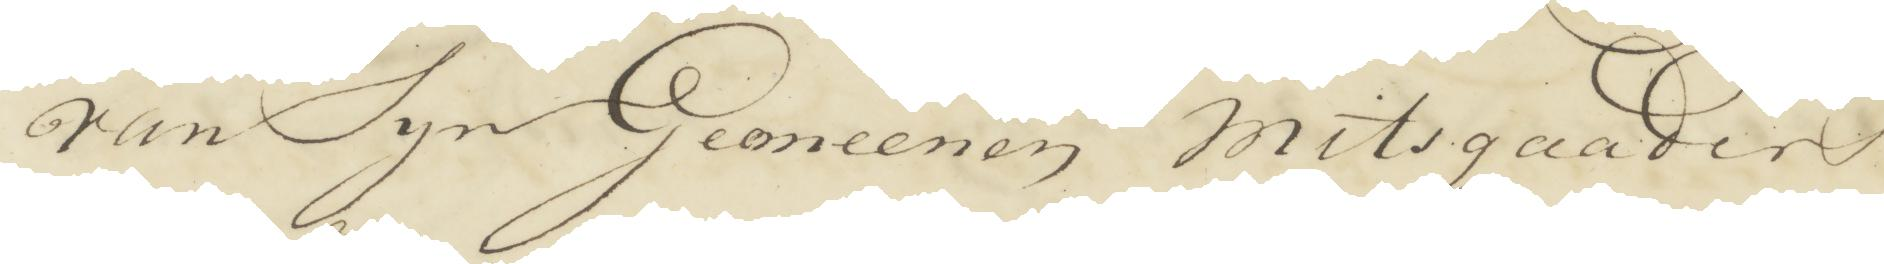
van Syn Gemeenen, mitsgaaders
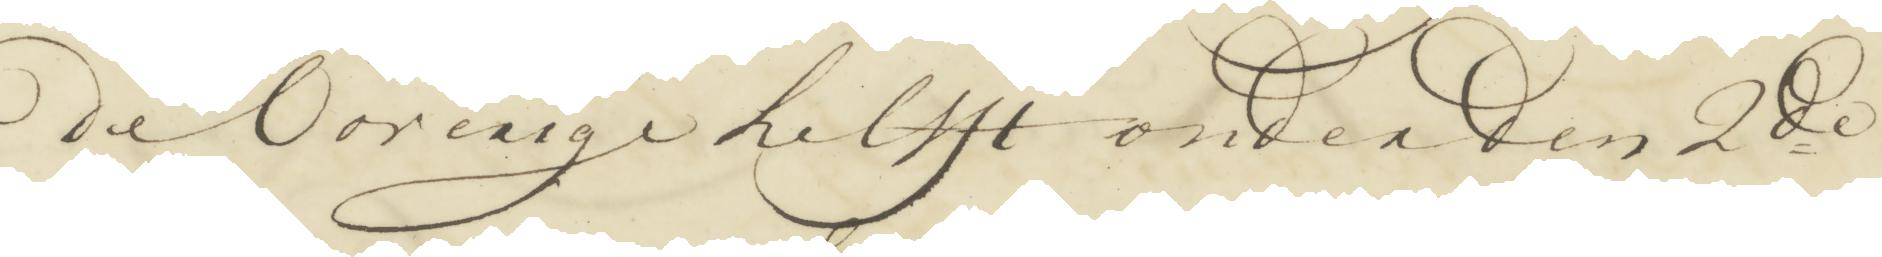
die Ooverige helfft onder den 2:de
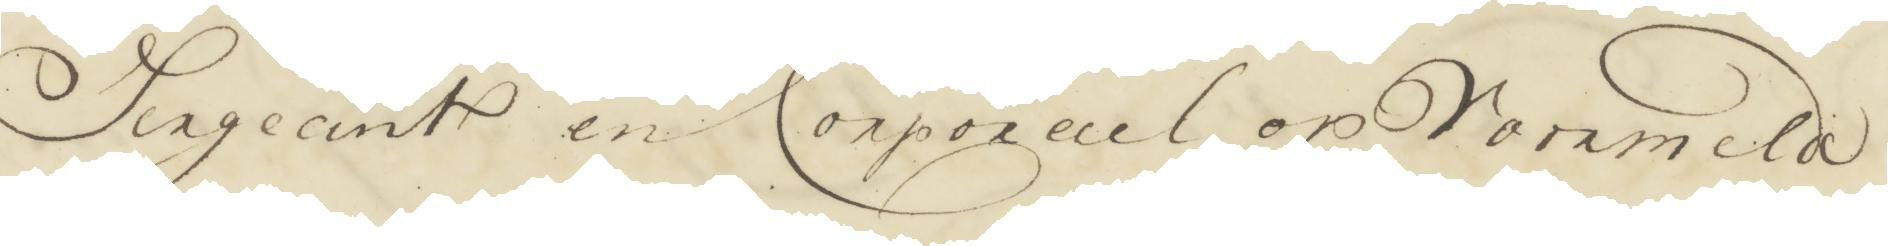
Sergeant en Corporael op Voormelde
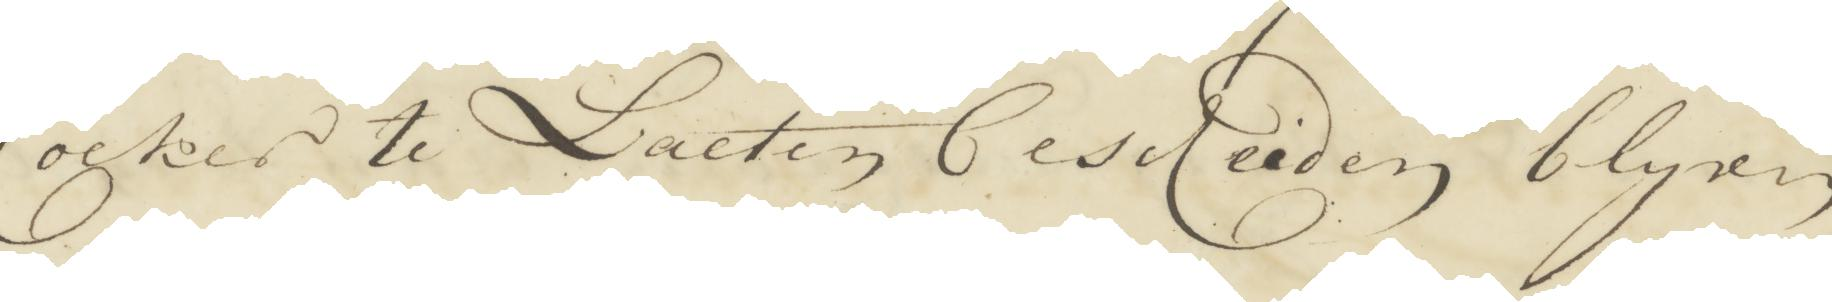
Coeker te Laeten bescheiden blyven
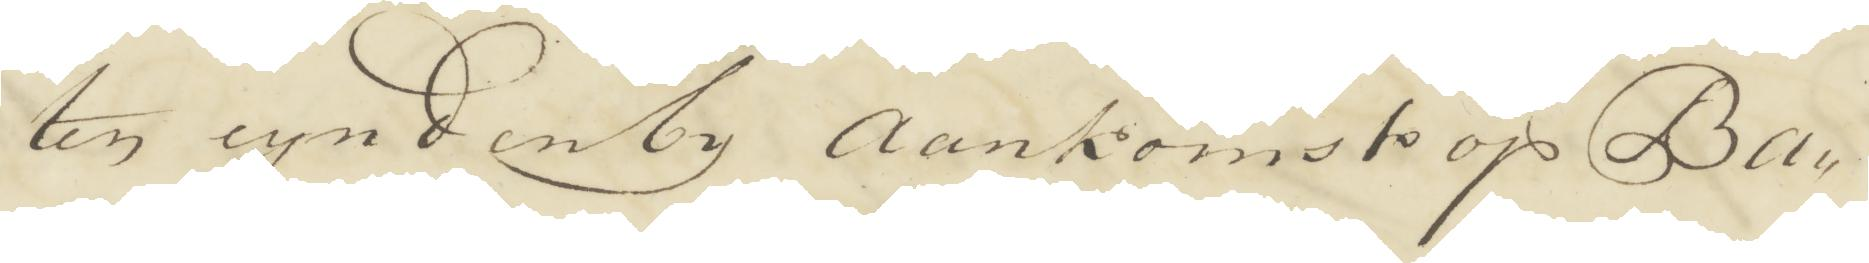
ten eynden by aankomst op Ba„
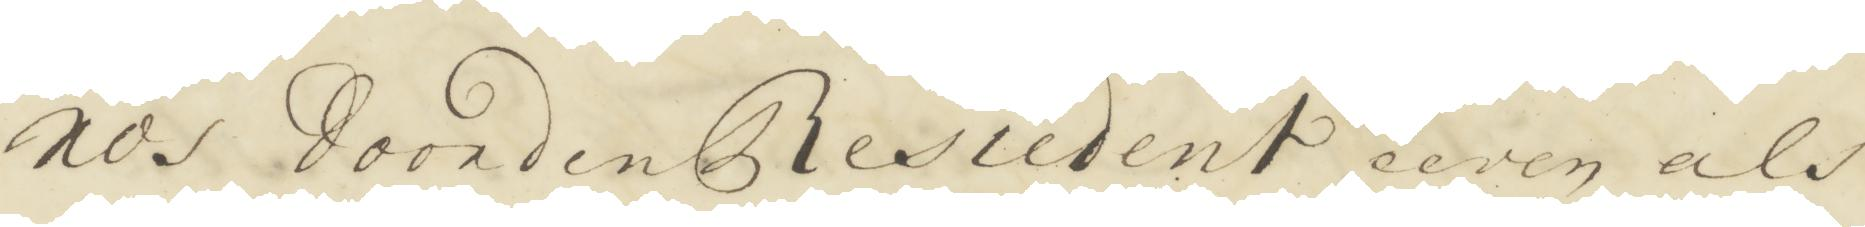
ros door den Resiedent eeven als
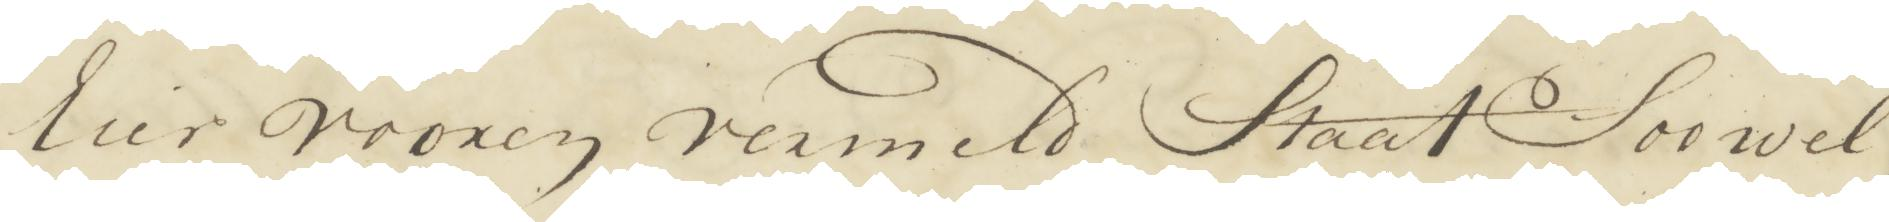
hier vooren vermeld Staat Soo wel
